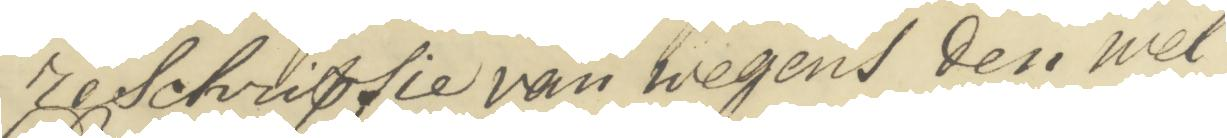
reschripsie van wegens den wel
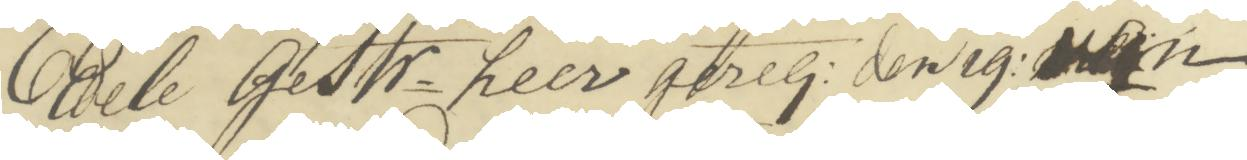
Edele Gestr= heer gereg: den 19: van
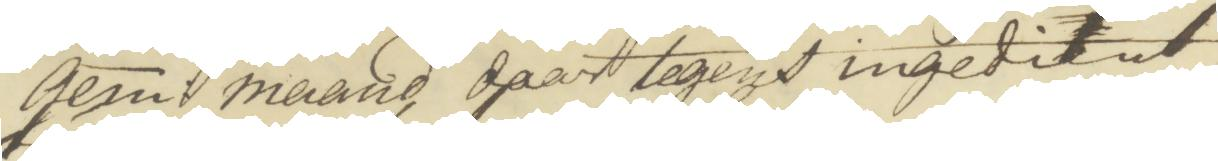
gem: maand, daar tegens ingedient
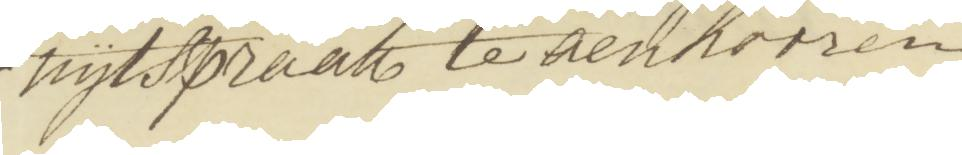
uijtspraak te aenhooren,
